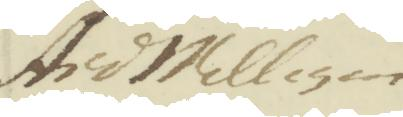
A v d Willigen
